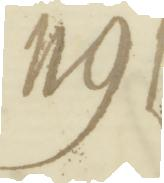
1191
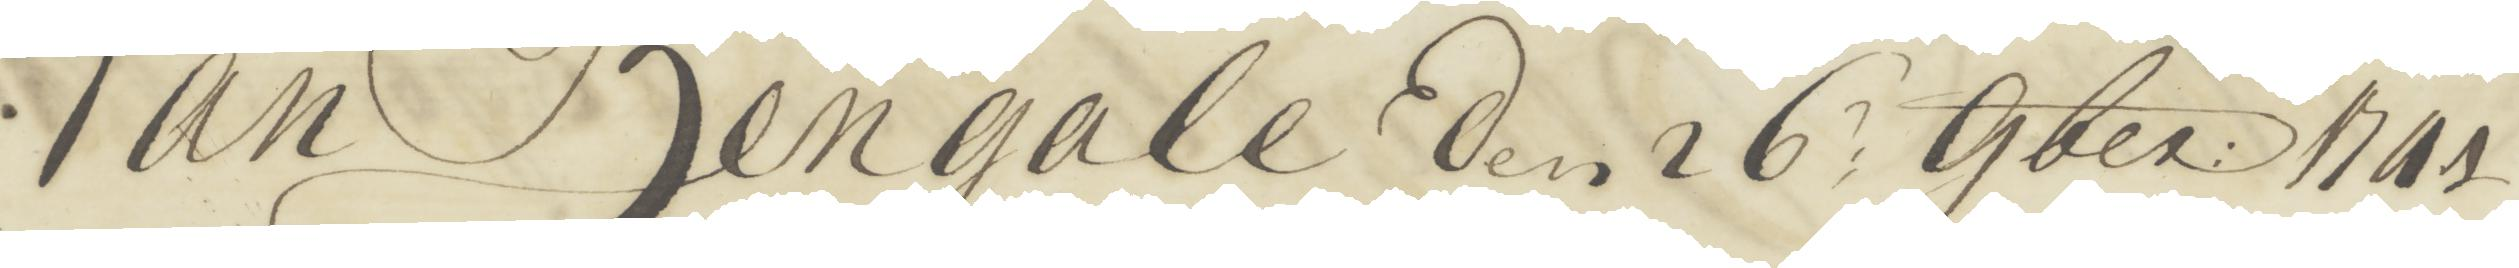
Van Bengale den 26„' 9ber: 1741
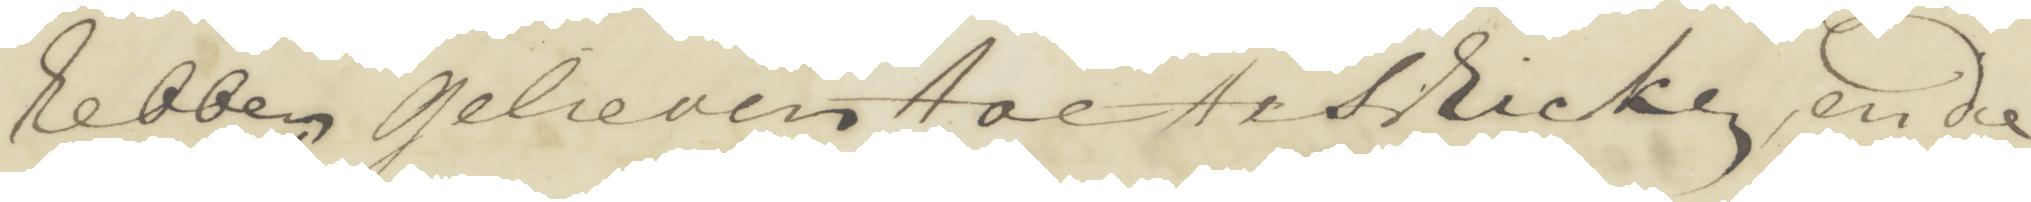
hebben gelieven toe te schicken, en die
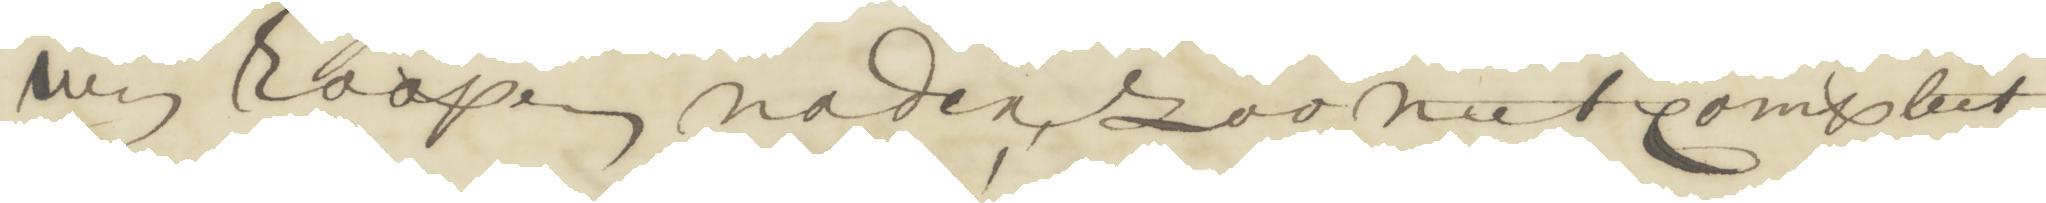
wij hoopen nader, zoo niet compleet
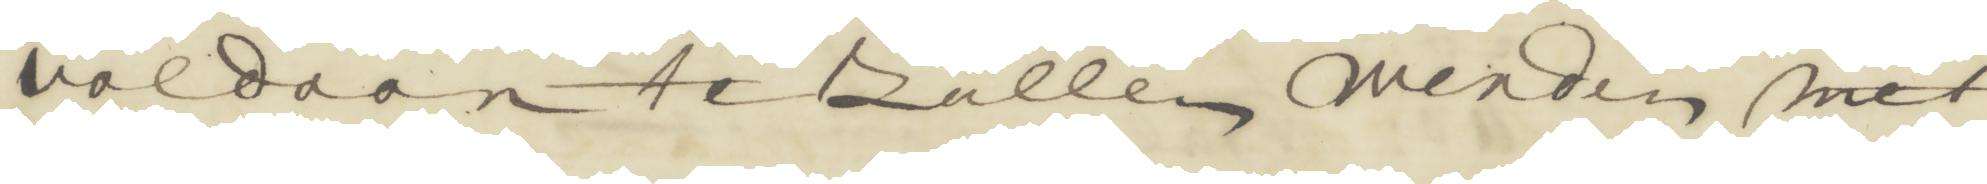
voldaan te zullen werden met
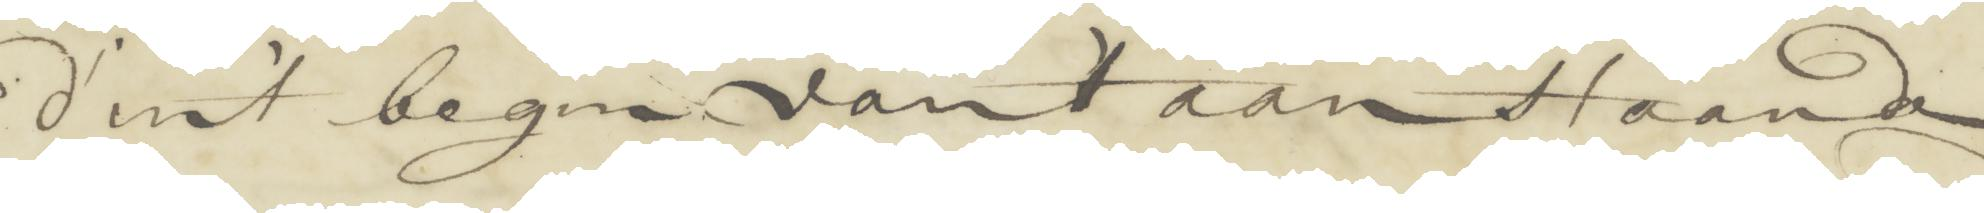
d’ in’t begin van't aanstaande
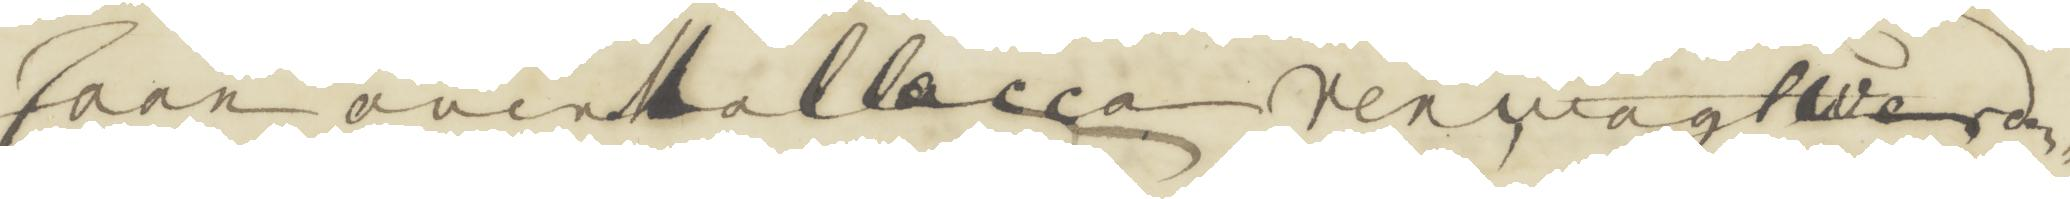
Jaar over Mallacca verwagt werden
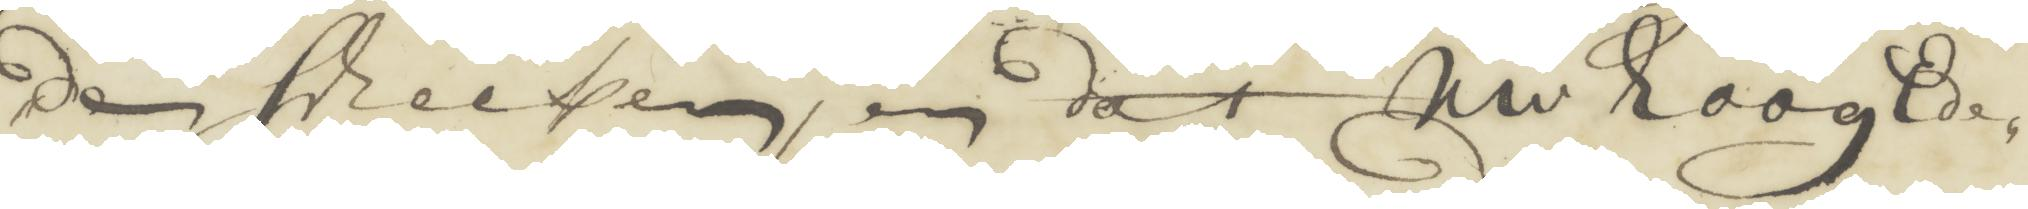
de scheepen, en dat uw hoog Ede„
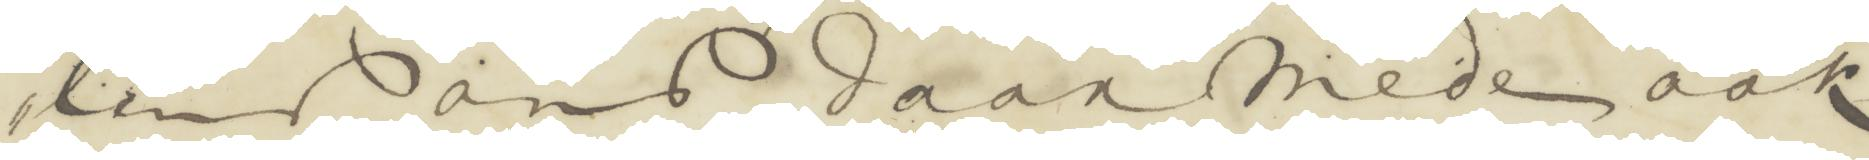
„lens ons daar mede ook
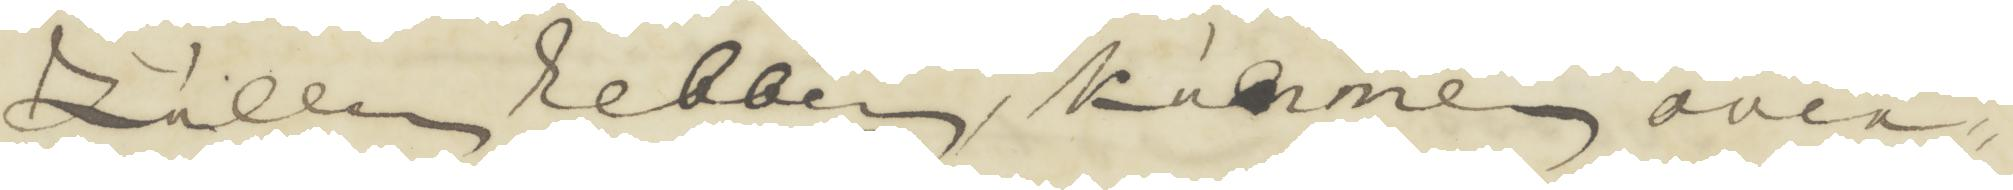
zullen hebben, kunnen over„
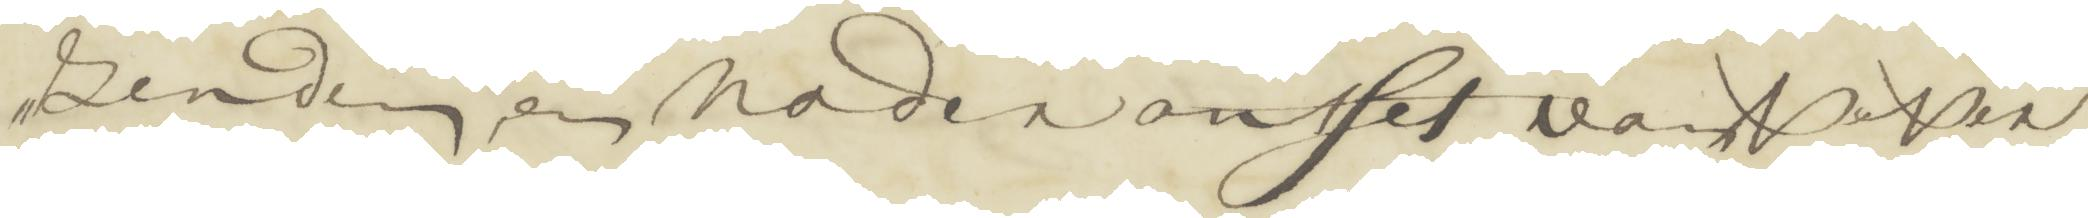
„zenden en nader ontset van peper
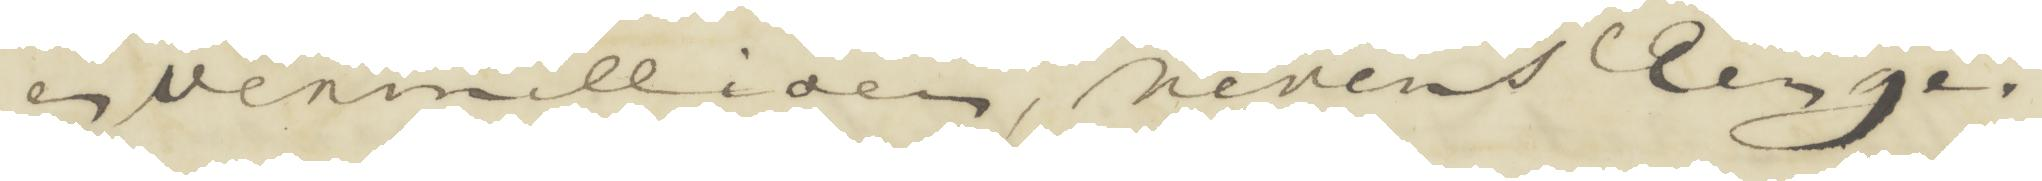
en vermillioen, nevens Een ge„
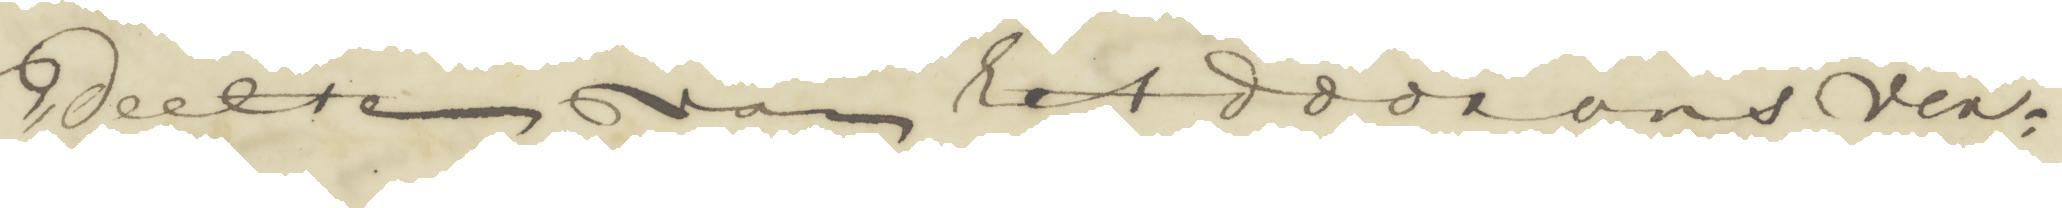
deelte van het door ons ver:
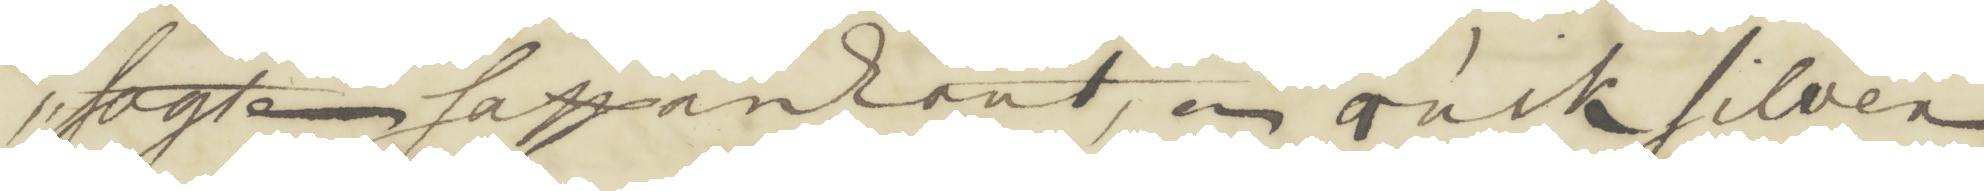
„sogte sappanhout, en quiksilver
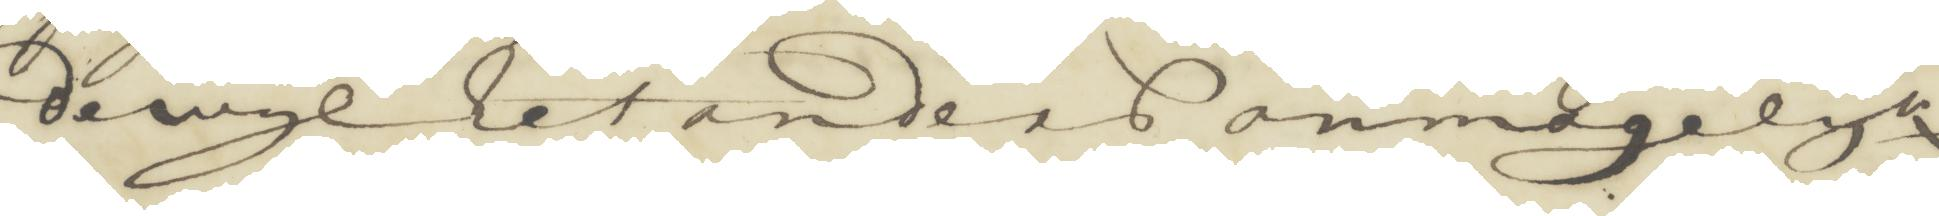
dewijl het anders onmogelijk
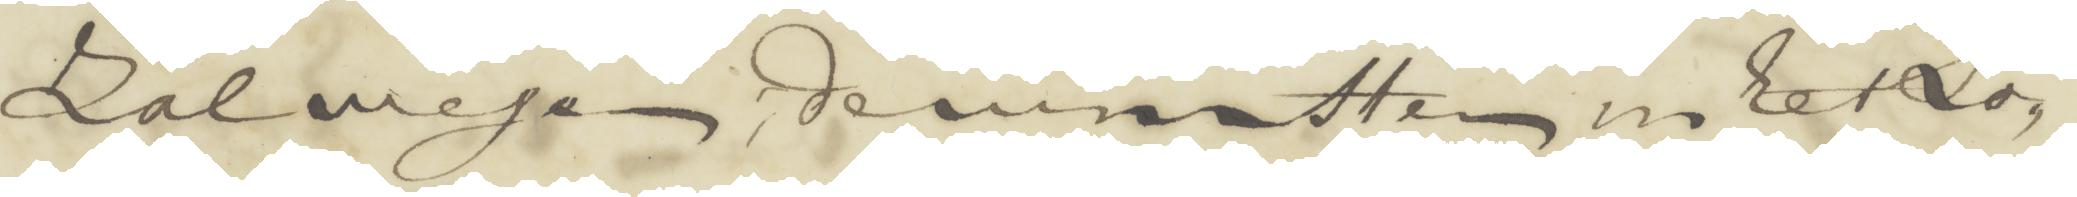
zal wesen, de winsten in het lo„
